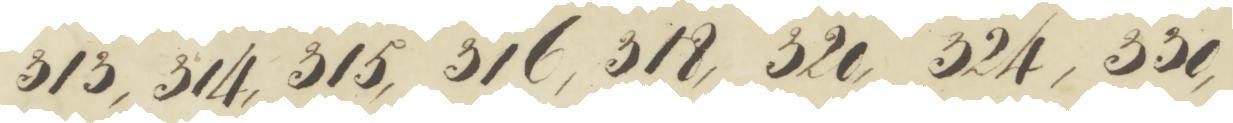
313, 314, 315, 316, 318, 320, 324, 330,
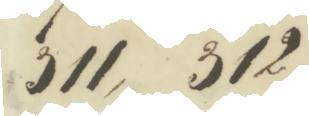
311, 312
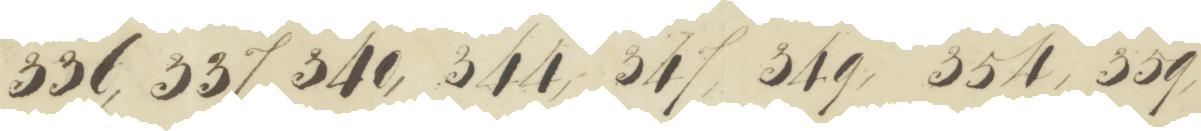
336, 337, 340, 344, 347, 349, 354, 359,
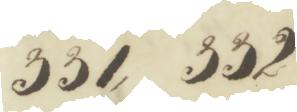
331, 332
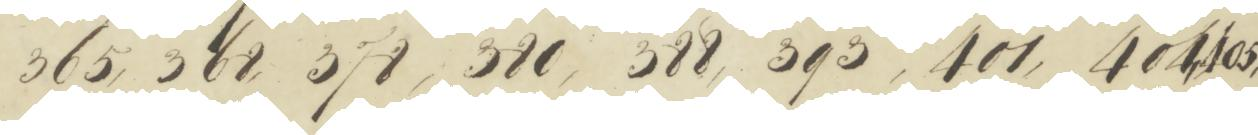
365, 368, 378, 380, 388, 393, 401, 404,405,
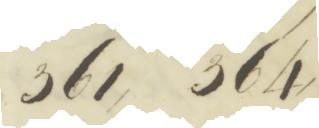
361, 364,
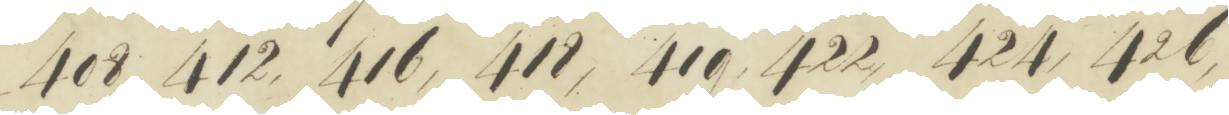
408, 412, 416, 418, 419, 422, 424, 426,
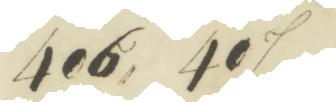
406, 407,
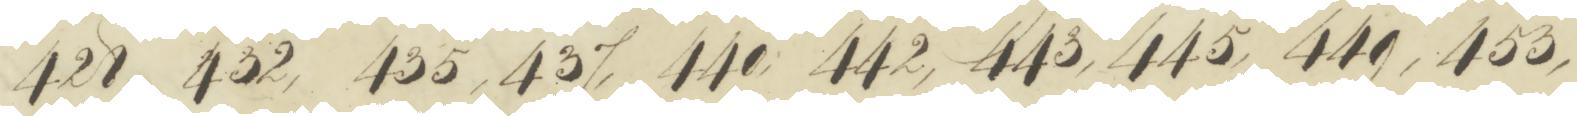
428, 432, 435, 437, 440, 442, 443, 445, 449, 453,
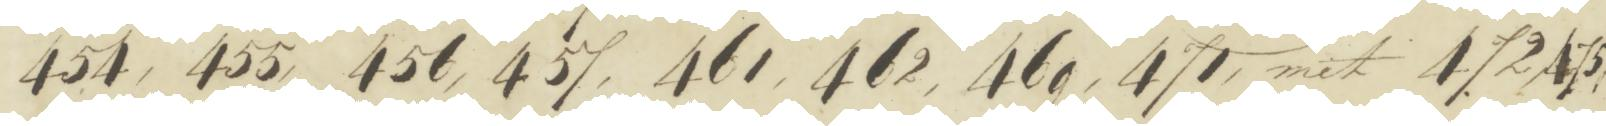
454, 455, 456, 457, 461, 462, 469, 471, met 472, 475,
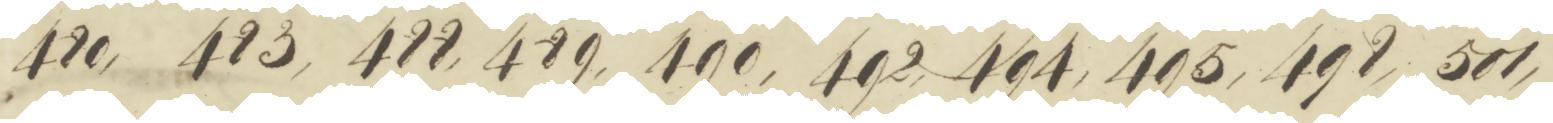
480, 483, 488, 489, 490, 492, 494, 495, 498, 501,
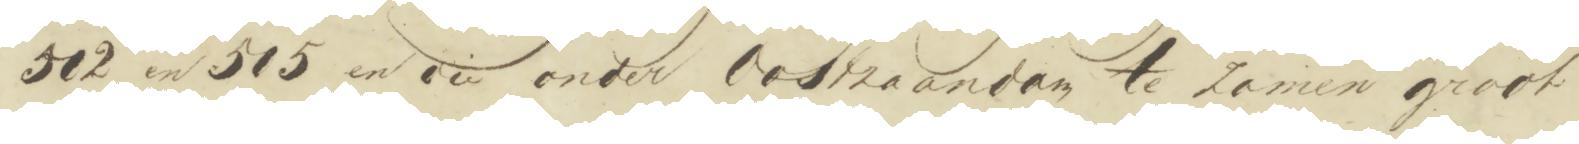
502 en 515 en die onder Oostzaandam te zamen groot
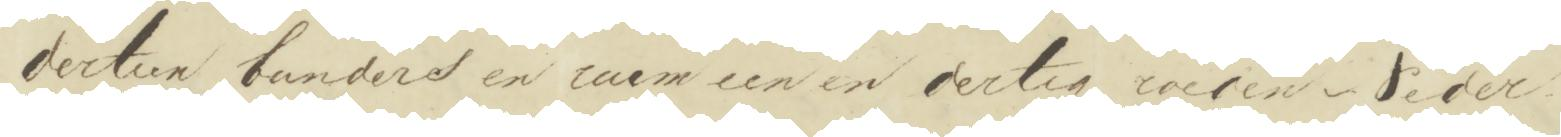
dertien bunders en ruim een en dertig roeden - Neder
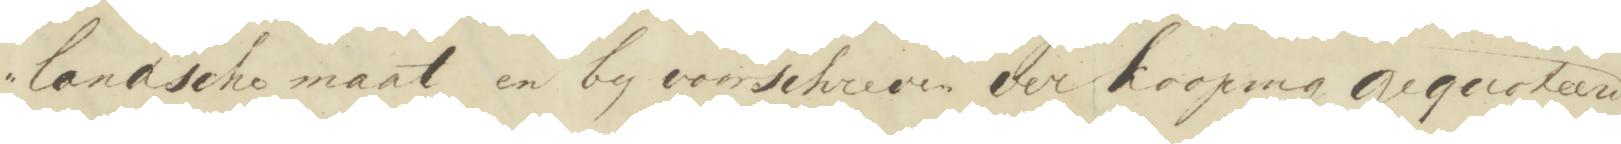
„landsche maat en by voorschreven verkooping gequoteerd
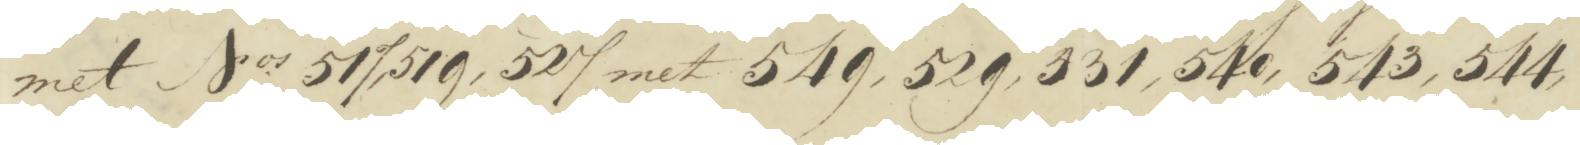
met N:os 517,519, 527 met 549, 529, 531, 540, 543, 544,
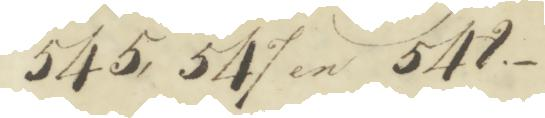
545, 547 en 548.-
